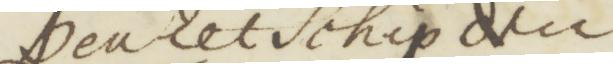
per het schip den
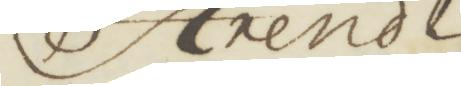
Arendt
